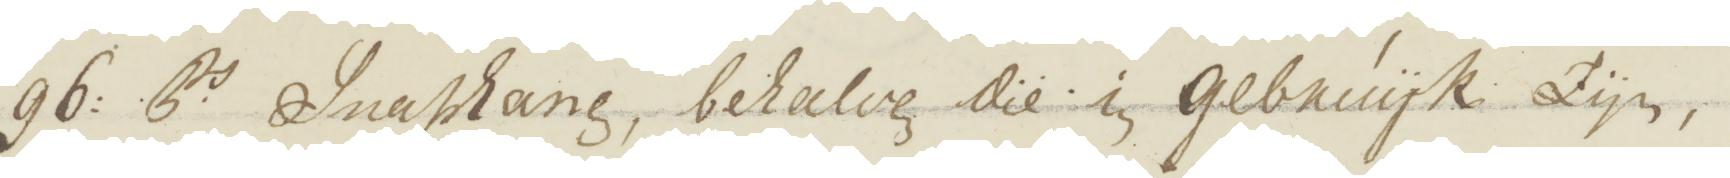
96: P:s snaphanen, behalven die in gebruijk zijn,
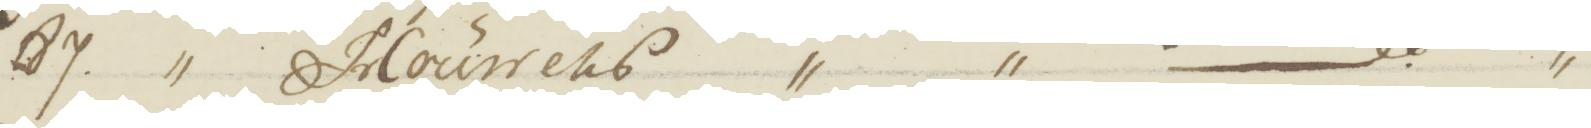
87. „ Houwers „ „ _.o „
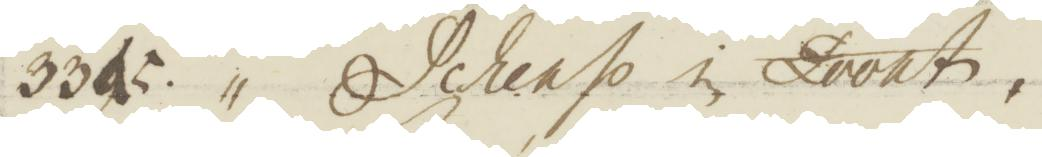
3345. „ scherp in zoort,
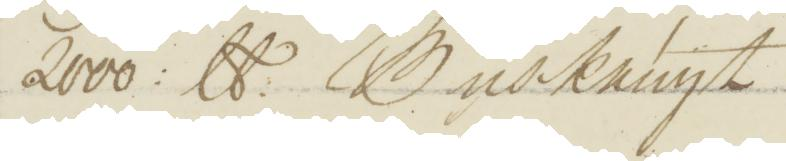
2000: lb: Buskruijt
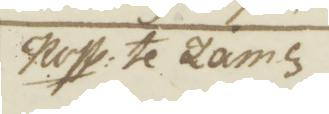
kopp: te zamen
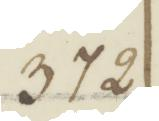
372.
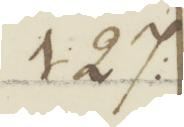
127:
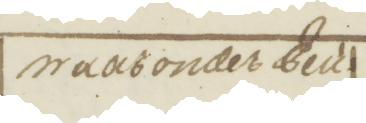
waaronder Eeu
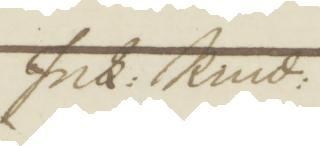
Ind: kind:
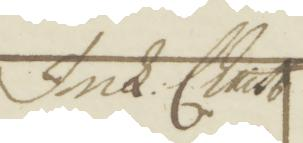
Ind: Christ
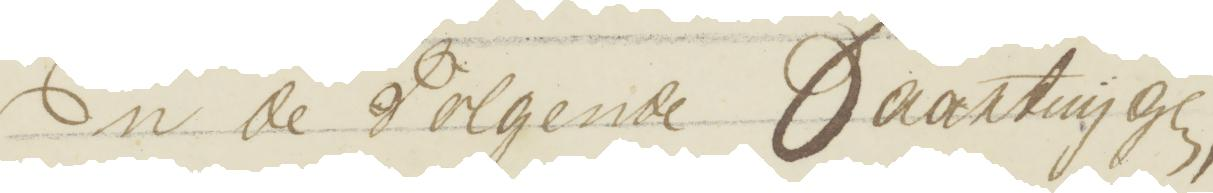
En de volgende Vaartuijgen
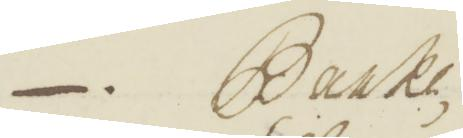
—. Barken
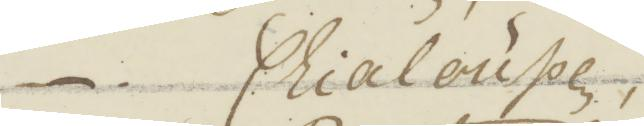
—. Chialoupen,
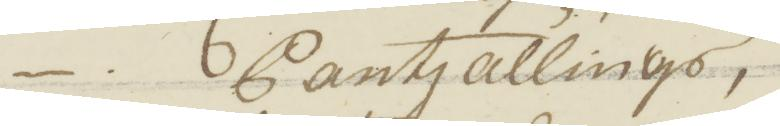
—. Pantjallings,
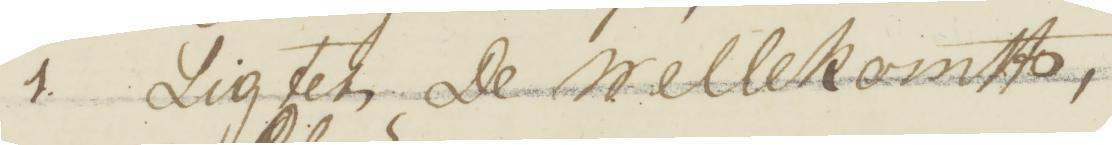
1. Ligter De wellekampp,
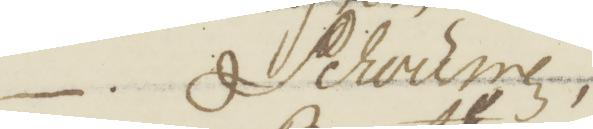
—. Schouwen,
